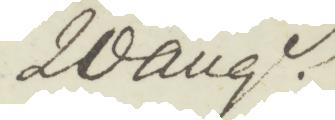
20 Aug.s
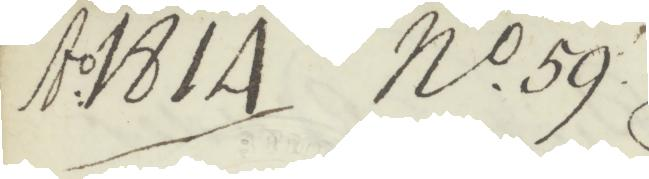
A:o1814 N.o 59.
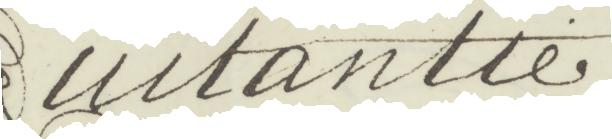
Quitantie
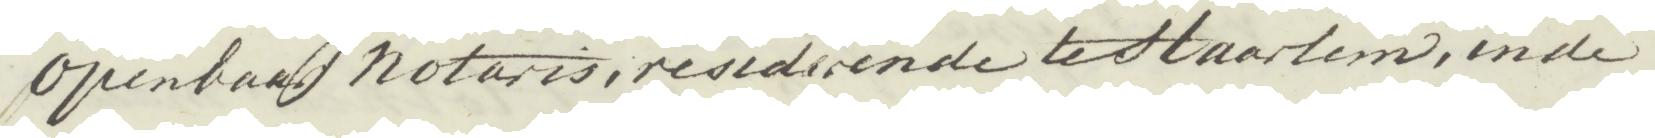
Openbaar Notaris, residerende te Haarlem, in de
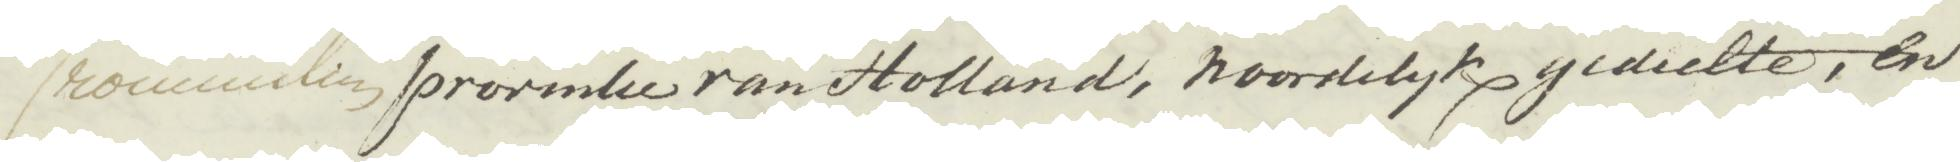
Crommelin provintie van Holland, Noordelyk gedeelte, en
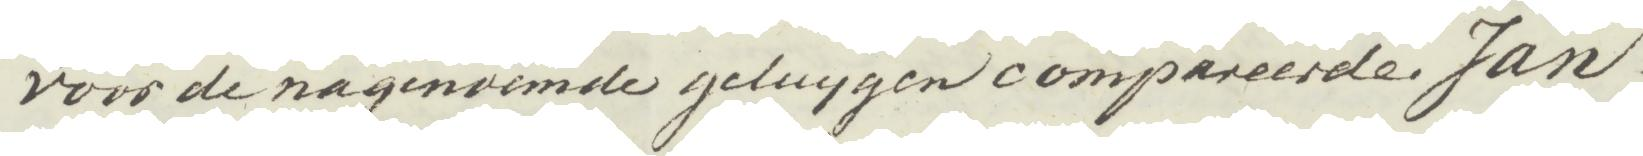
voor de nagenoemde getuygen compareerde Jan
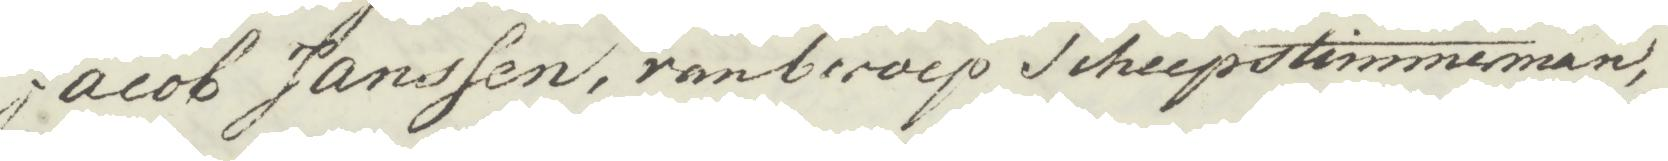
Jacob Janssen, van beroep scheepstimmerman,
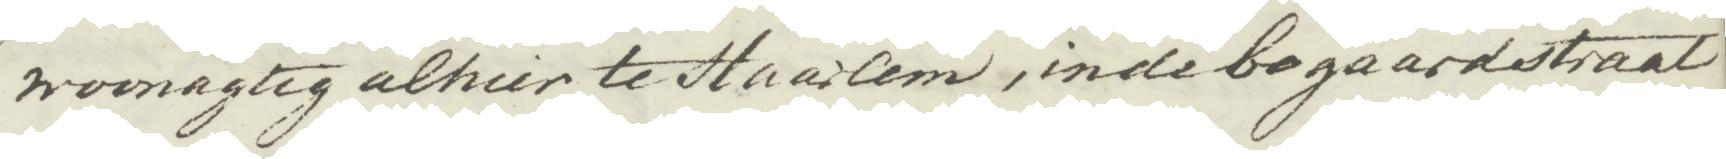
woonagtig alhier te Haarlem, in de bogaardstraat
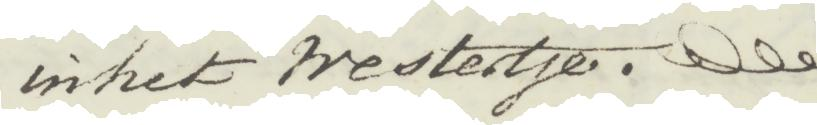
in het Westertje.
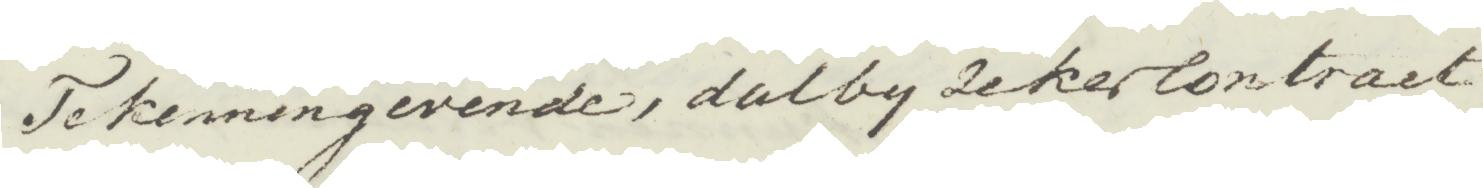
Te kennengevende, dat by zeker contract
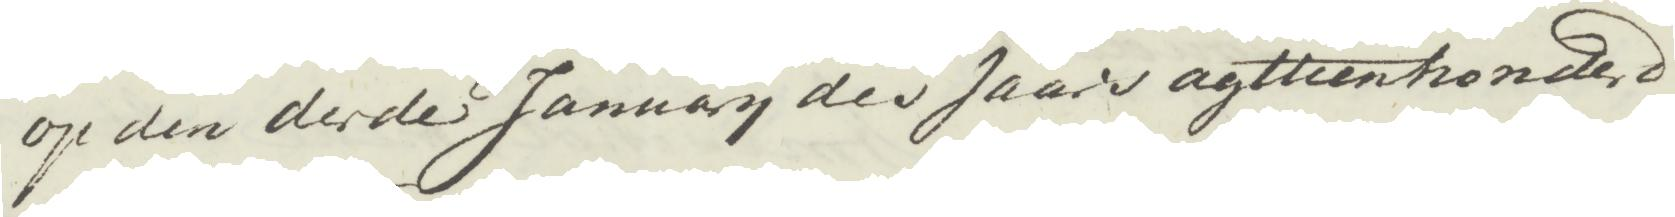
op den derde January des Jaars agttienhonderd
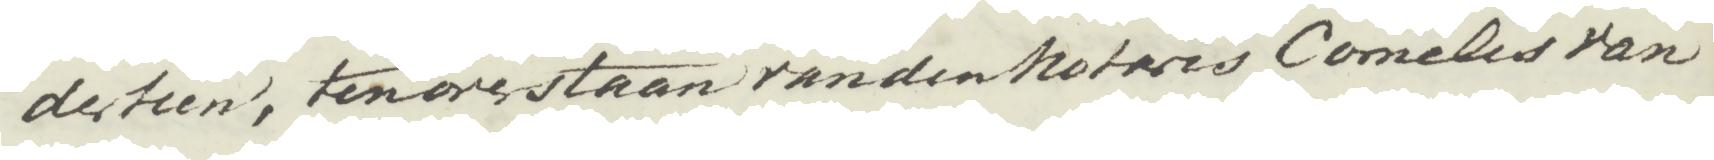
dertien, tenoverstaan van den Notaris Cornelis van
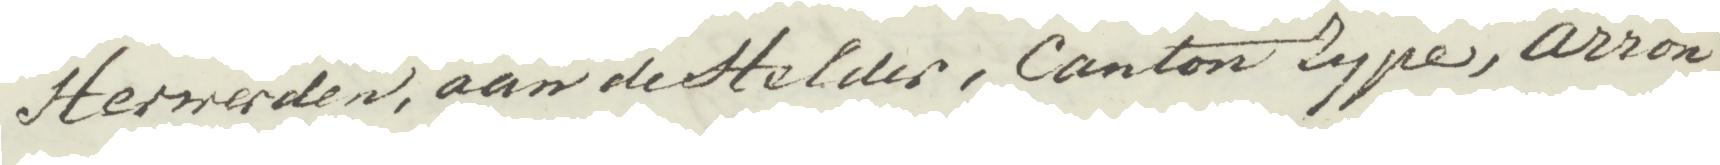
Herwerden, aan de Helder, Canton Zype, arron
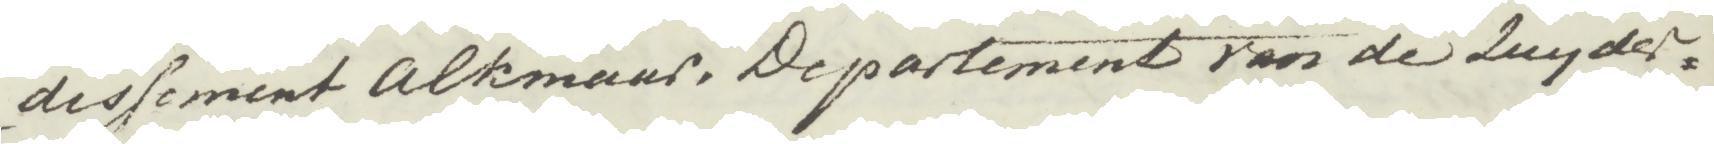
=dissement Alkmaar, Departement van de Zuyder=
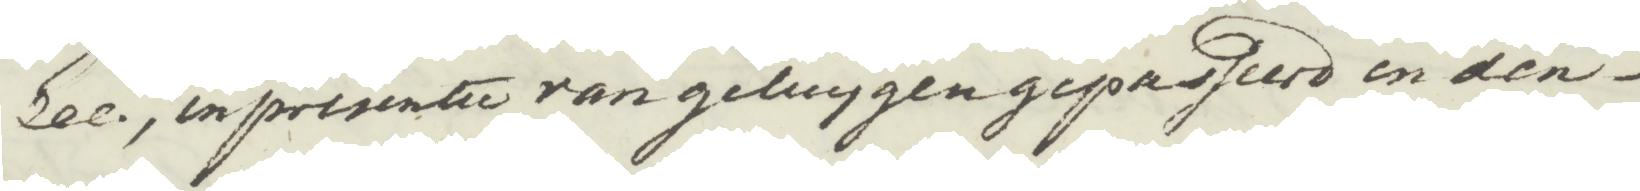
zee, in presentie van getuygen gepasseerd en den -
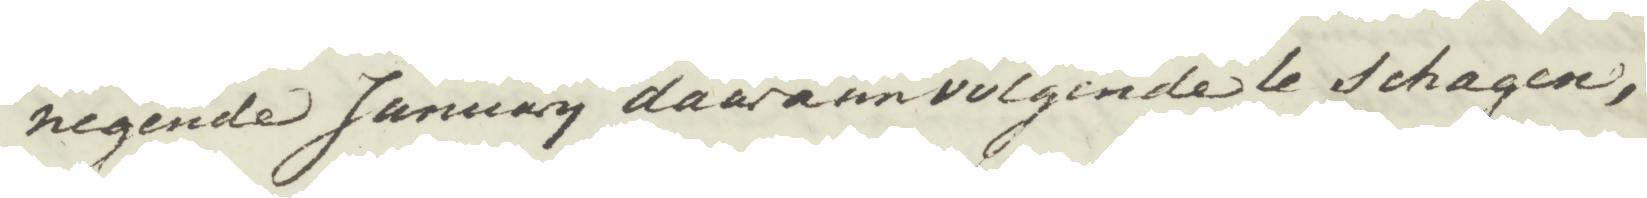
negende January daaraanvolgende te schagen,
